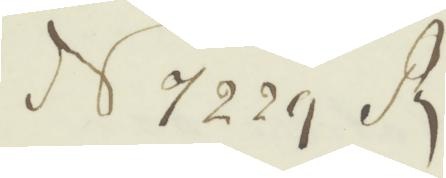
N 7229 R
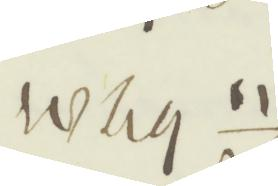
1849 11/23
